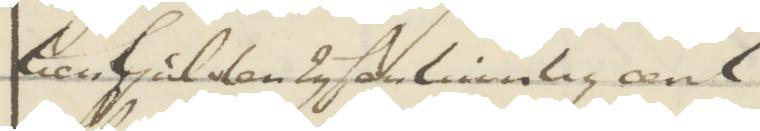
tien Gulden Vyfentwintig cent
